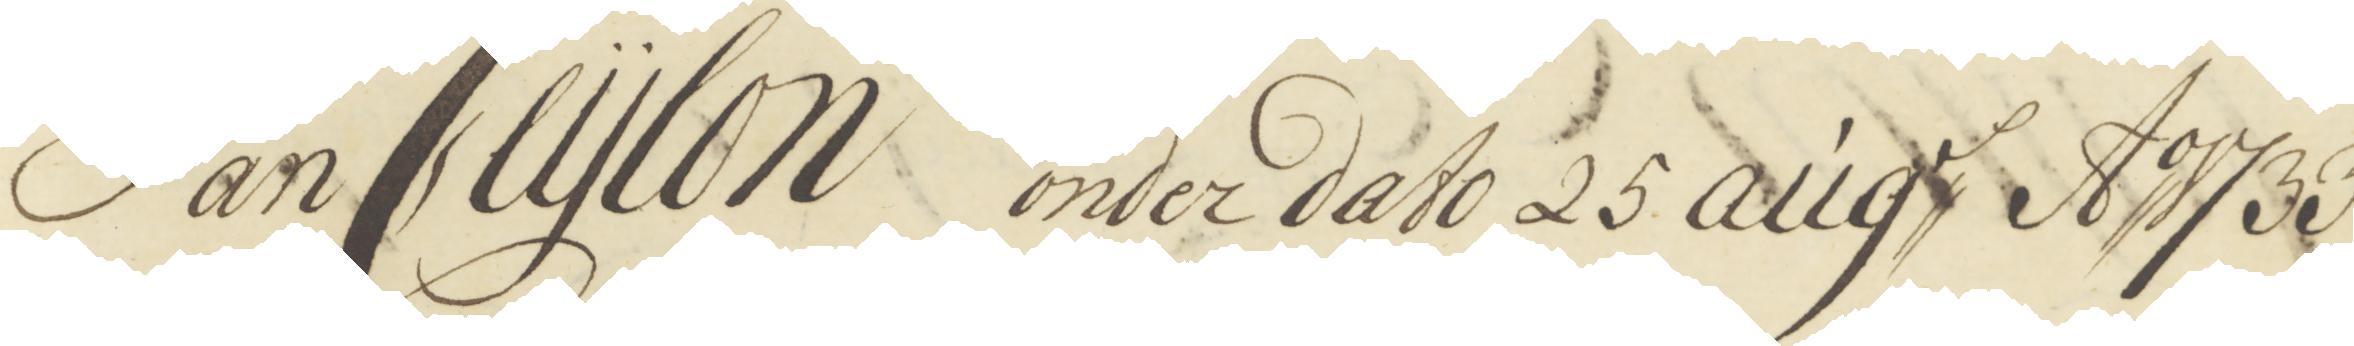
Van Ceijlon onder dato 25 aug„s A:o 1733
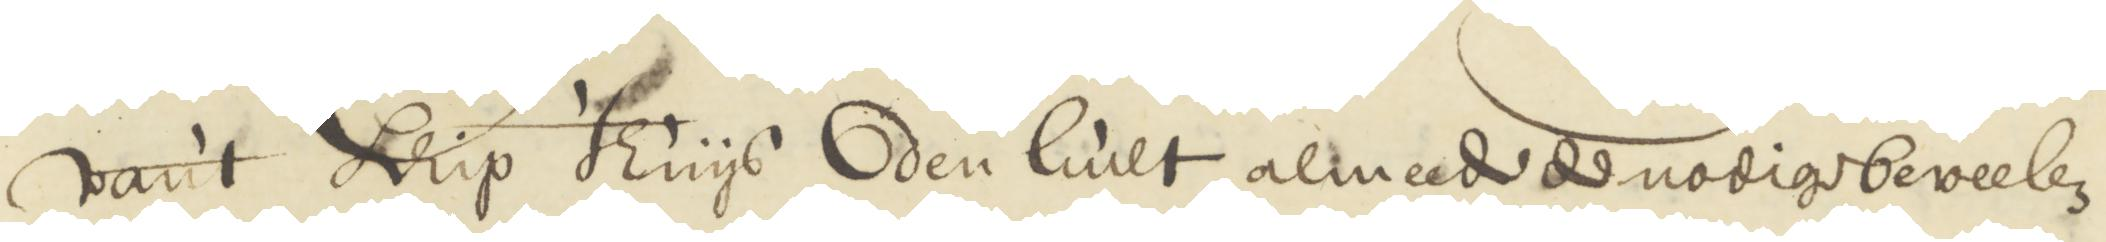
van’t schip t'huijs den hult almeede de nodige beveelen
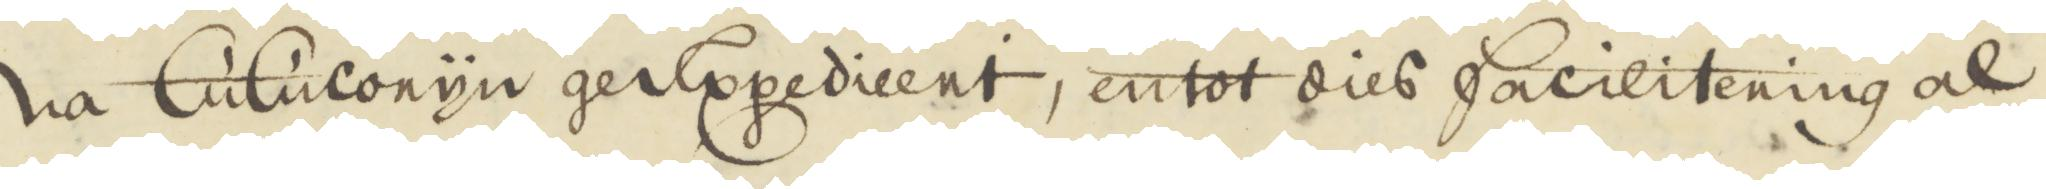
na tutucorijn geexpedieert, en tot dies facilitering al
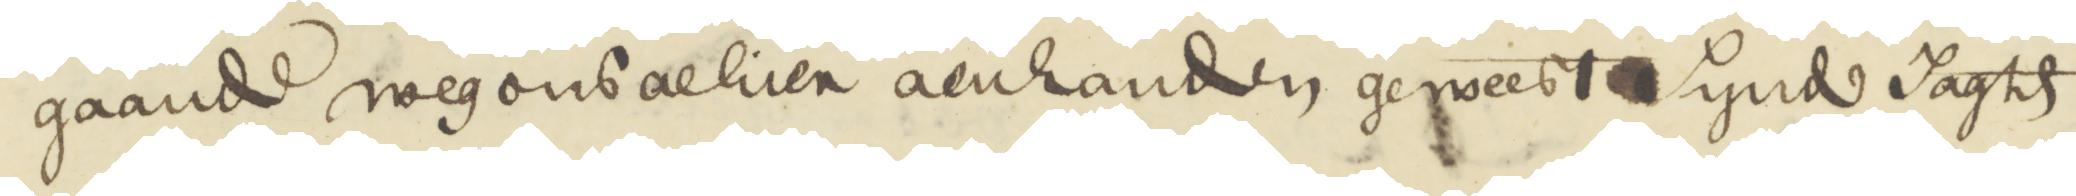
gaande weg ons alhier aenhanden geweest Synde Iagten
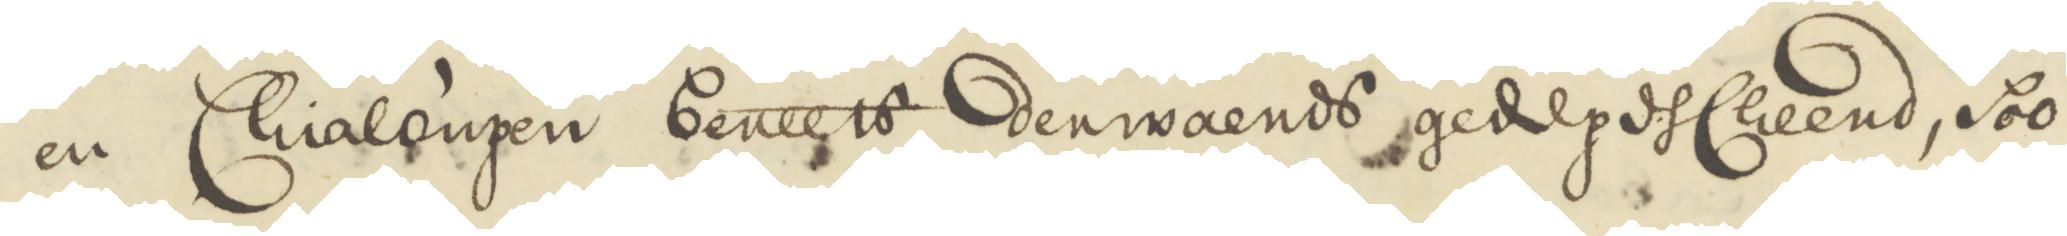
en Chialoupen bereets derwaerds, gedepescheerd, Soo
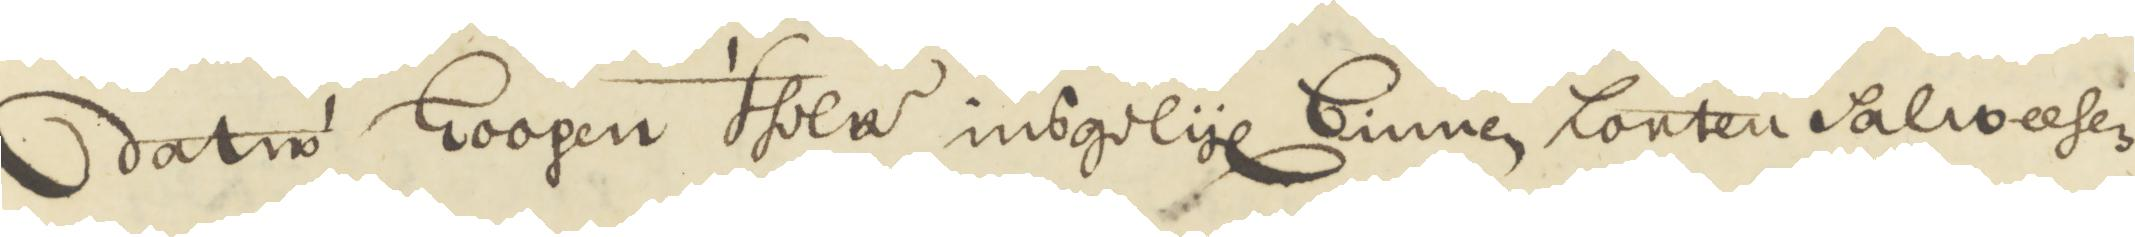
datw' hoopen 't selve insgelijx binnen korten sal weesen
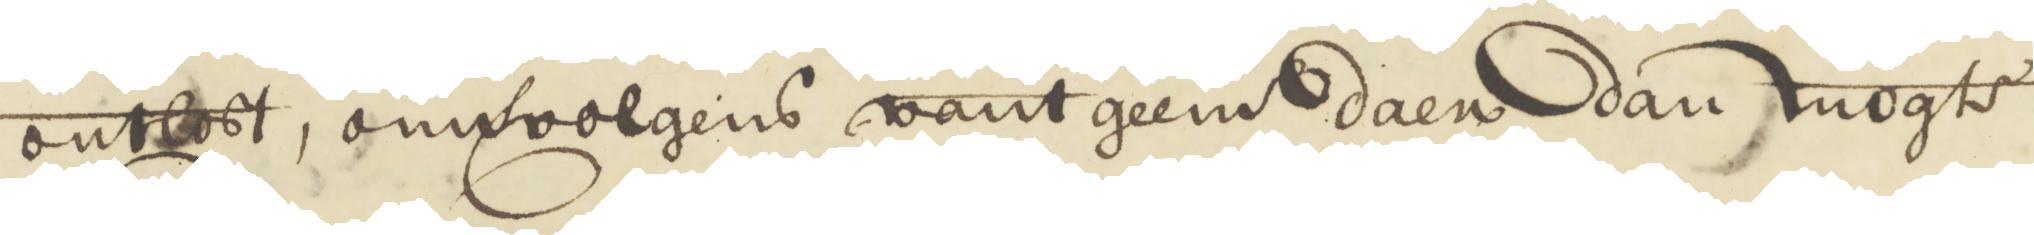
ontlost, om vervolgens van't geene daer dan mogte
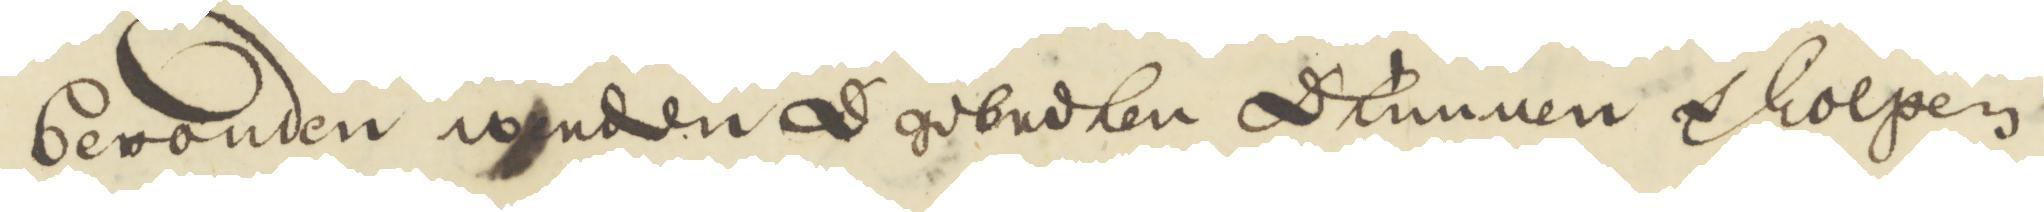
bevonden werden te gebreken te kunnen verholpen
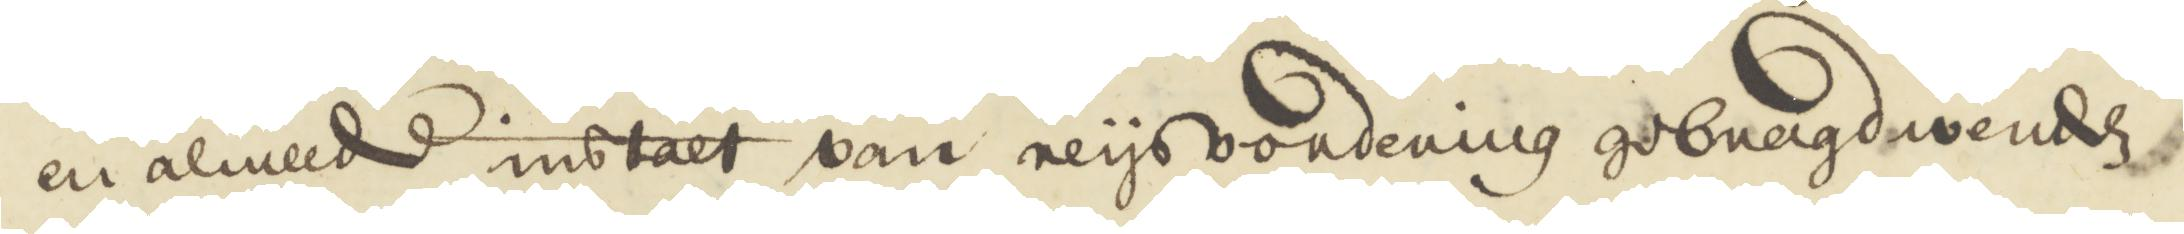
en almeede instaet van reijsvordering gebragd wenden
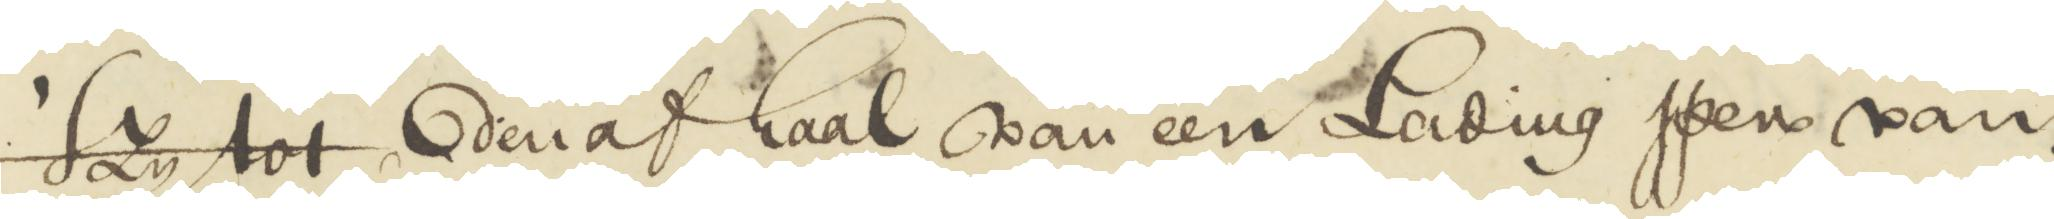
’t Zy tot den afhaal van een lading peper van
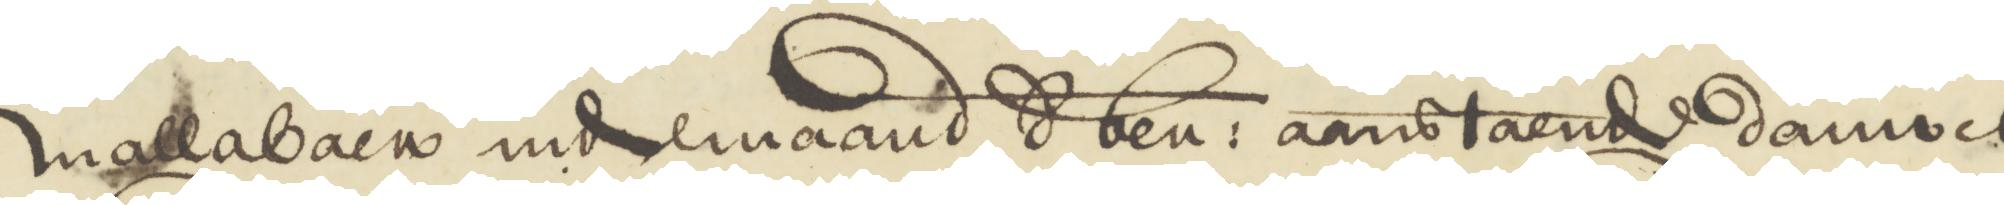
mallabaer in de maand 8ber: aanstaende dan wel
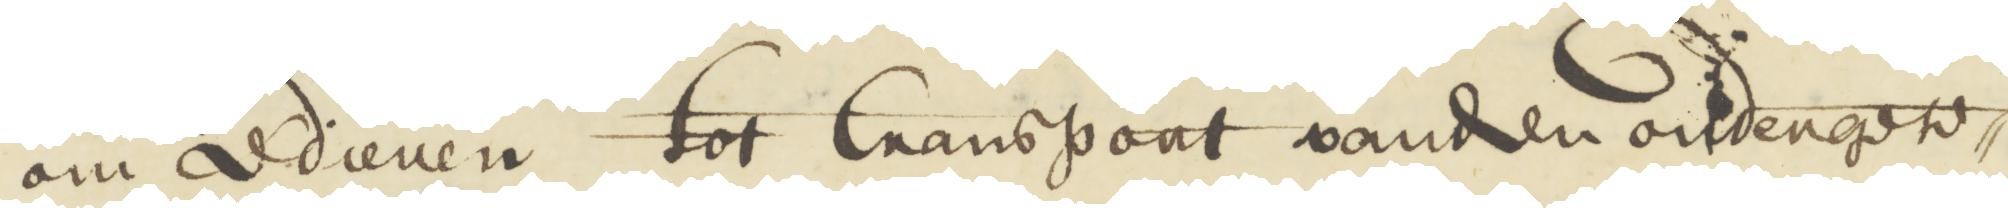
om te dienen tot transport vanden ondergete„
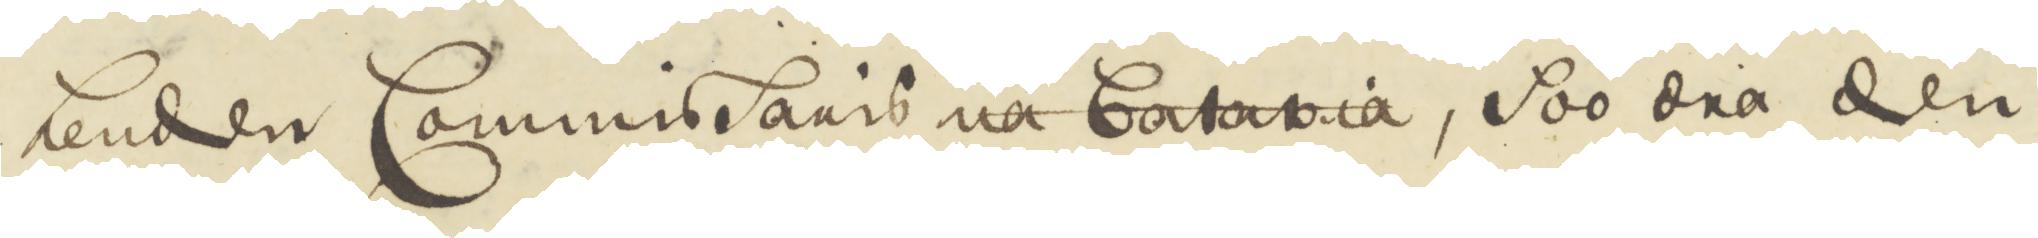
kenden Commissaris na batavia, Soo dra den
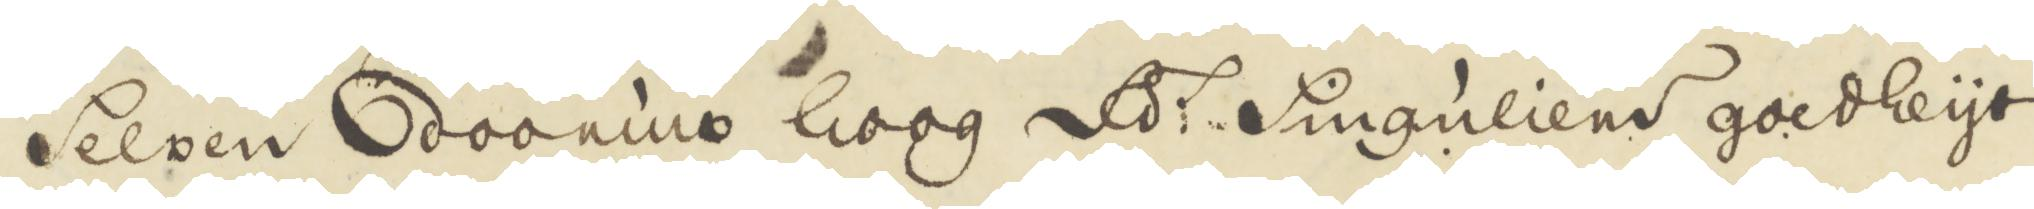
Selven door uw hoog Ed:s Singuliere goedheijt
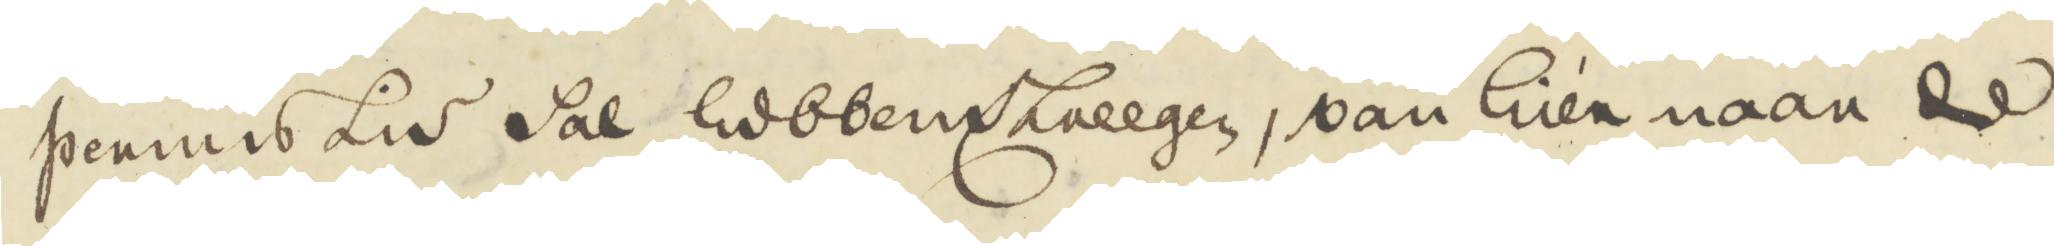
permissie Sal hebben verkreegen, van hier naar de
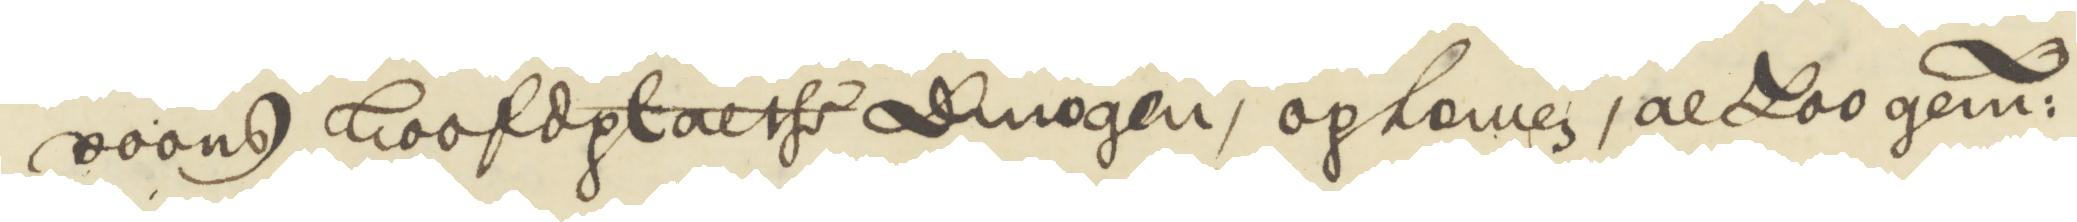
voors hoofdplaetse te mogen, opkomen, al Zoo gem:
